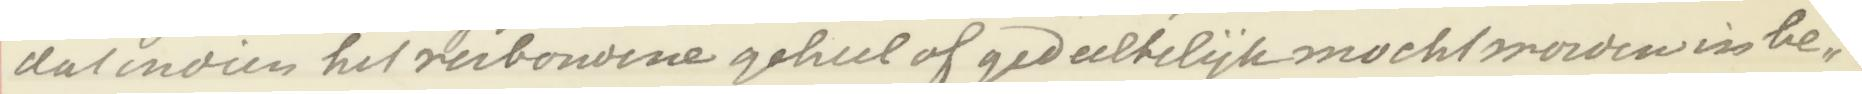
dat indien het verbondene geheel of gedeeltelijk mocht worden in be„
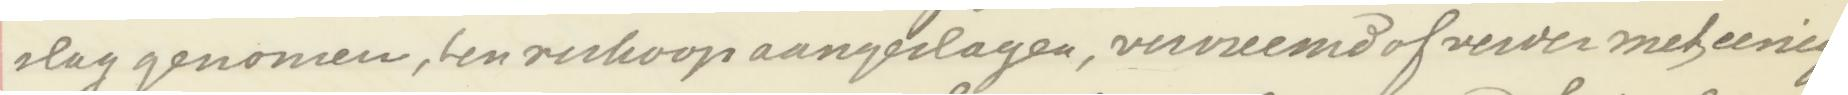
slag genomen, ten verkoop aangeslagen, vervreemd of verder met eenig
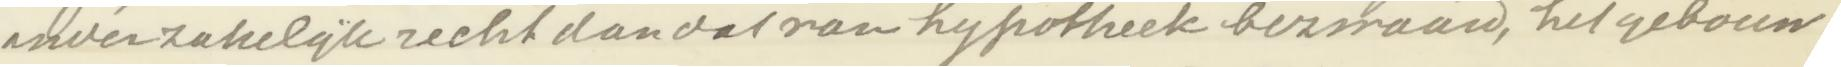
ander zakelijk recht dan dat van hypotheek bezwaard, het gebouw
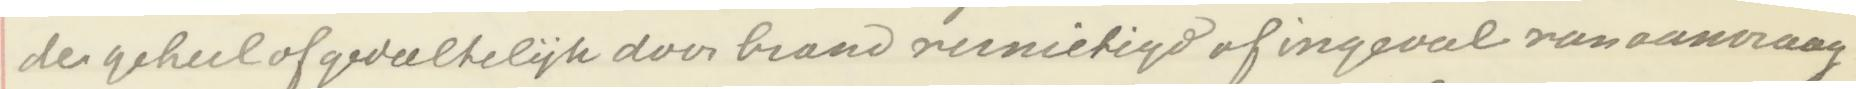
de geheel of gedeeltelijk door brand vernietigd of ingeval van aanvraag
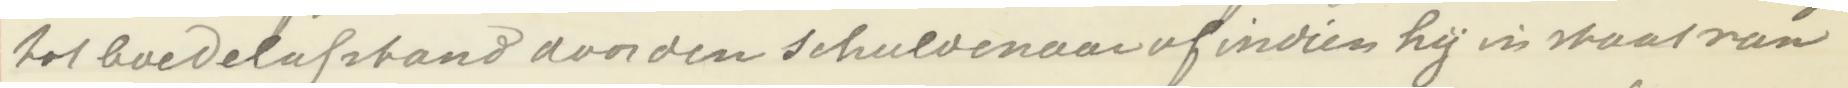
tot boedelafstand door den schuldenaar of indien hij in staat van
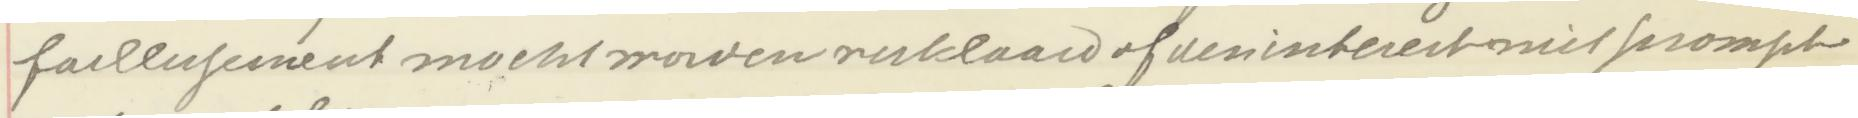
faillissement mocht worden verklaard of den interest niet prompt
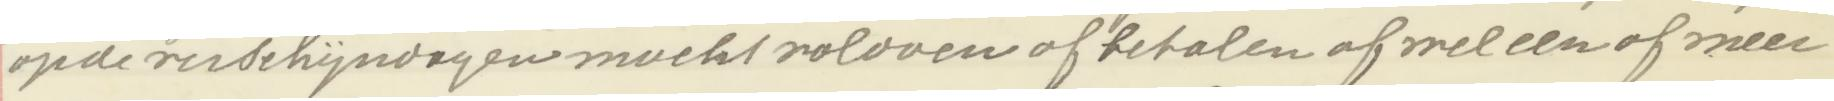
op de verschijndagen mocht voldoen of betalen of wel een of meer
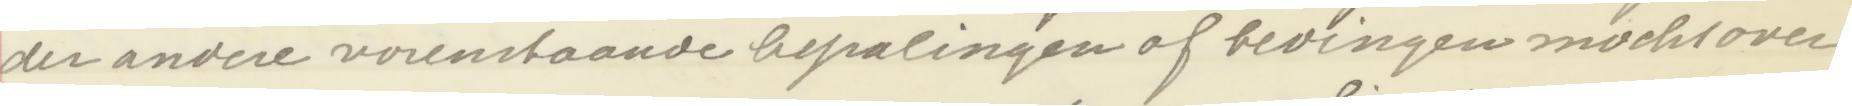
der andere vorenstaande bepalingen of bedingen mocht over
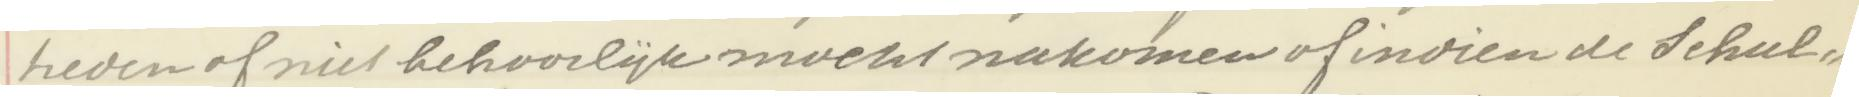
treden of niet behoorlijk mocht nakomen of indien de schul„
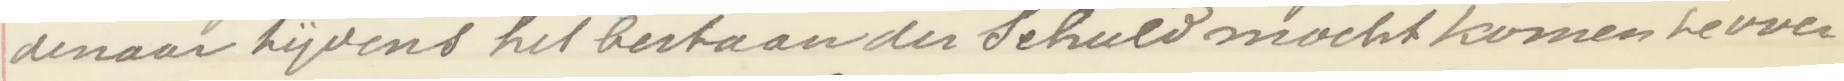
denaar tijdens het bestaan der schuld mocht komen te over
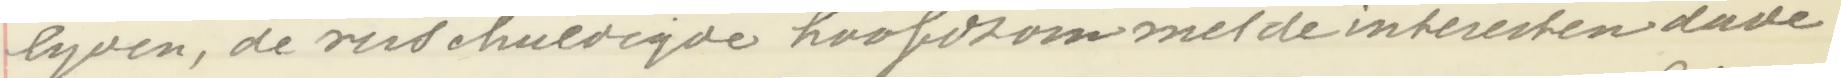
lyden, de verschuldigde hoofdsom met de interesten dade
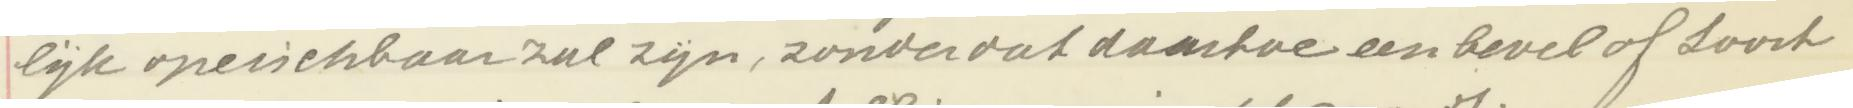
lijk opeischbaar zal zijn, zonder dat daartoe een bevel of zoort
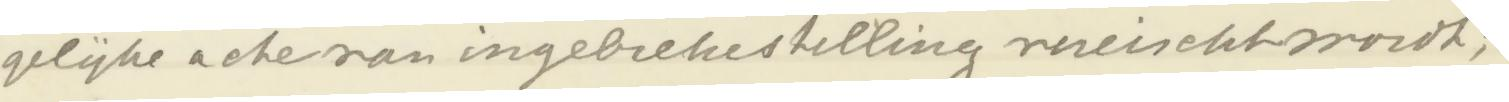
gelijke acte van ingebrekestelling vereischt wordt;
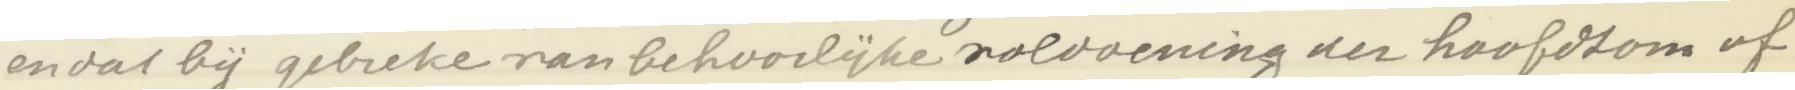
en dat bij gebreke van behoorlijke voldoening der hoofdzom of
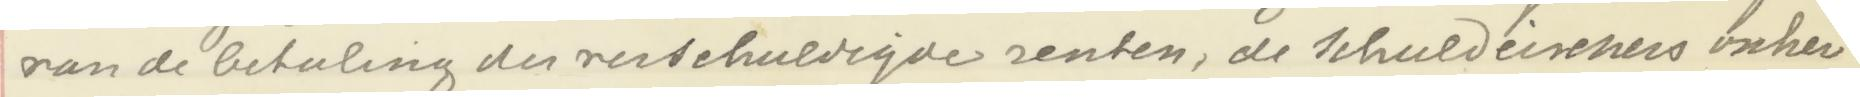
van de betaling der verschuldigde renten, de schuldeischers onher
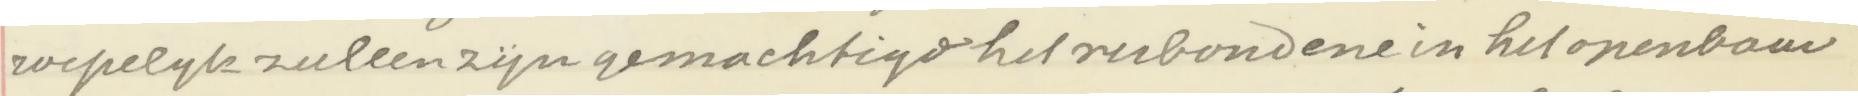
roepelyk zullen zijn gemachtigd het verbondene in het openbaar
